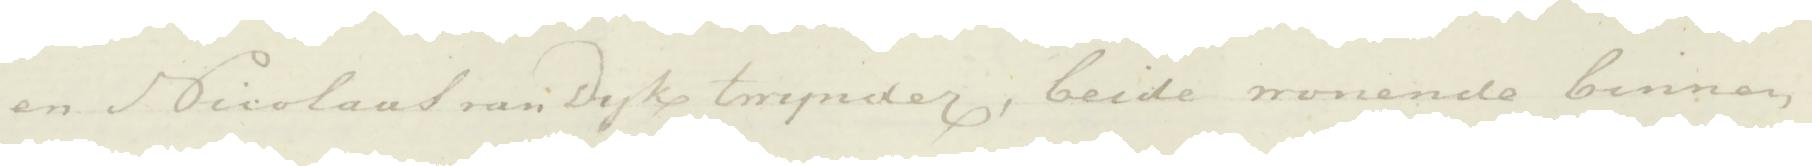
en Nicolaas van dyk twynder, beide wonende binnen
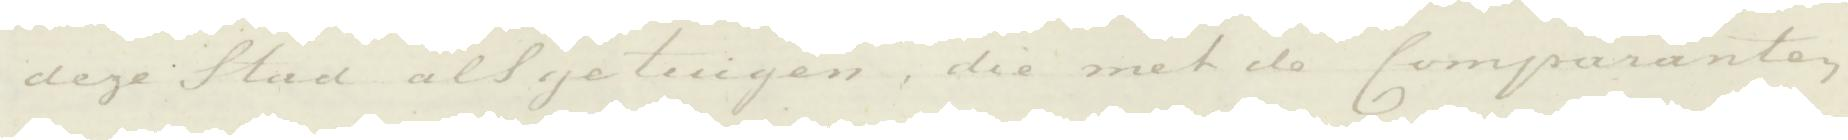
deze stad als getuigen, die met de Comparanten
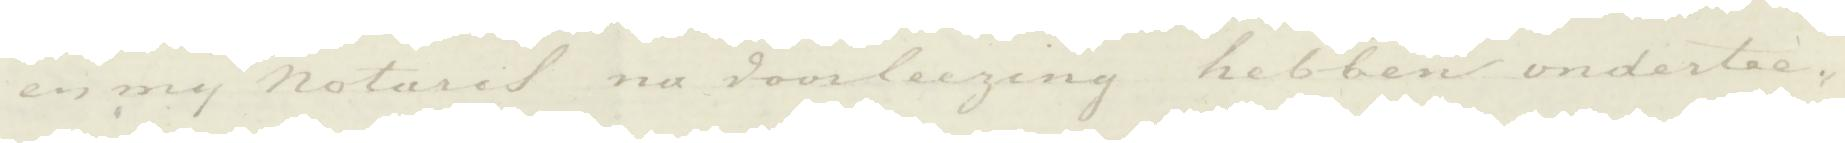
en my Notaris na voorleezing hebben ondertee„
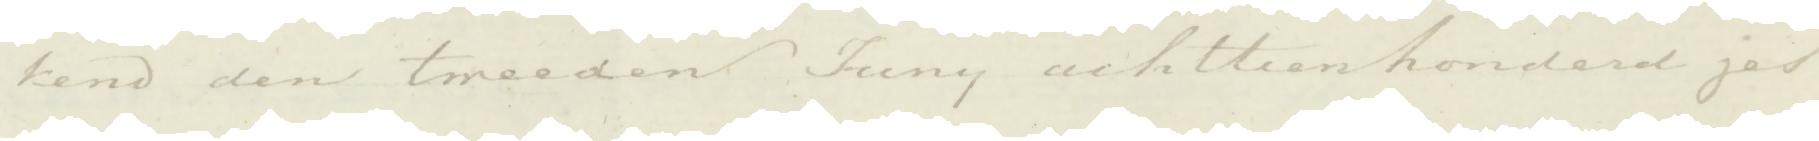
kend den tweeden Iuny achttien honderd zes
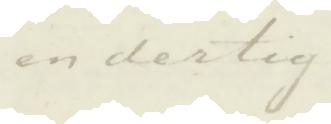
en dertig
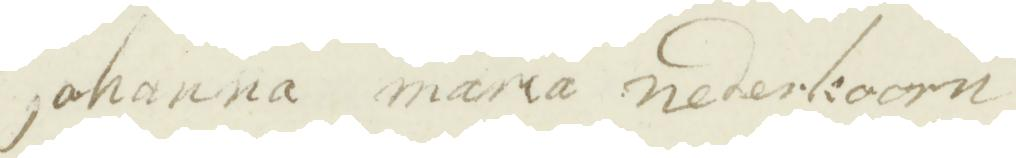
johanna maria nederkoorn
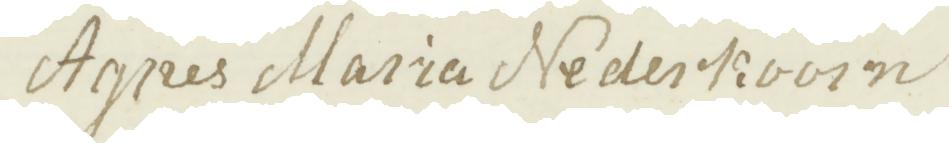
Agnes Maria Nederkoorn
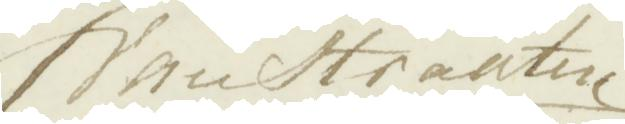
Jvanstraaten
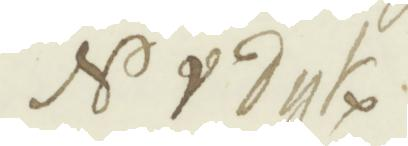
N v Dyk
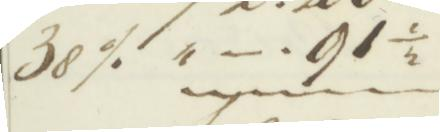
38% „ —. 91½
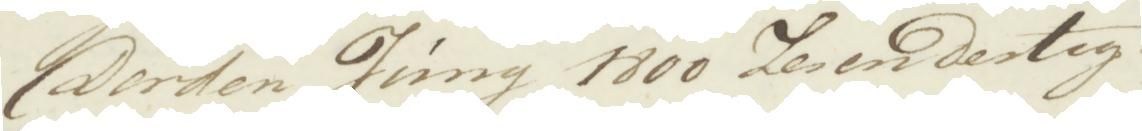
Derden Juny 1800 zes en dertig
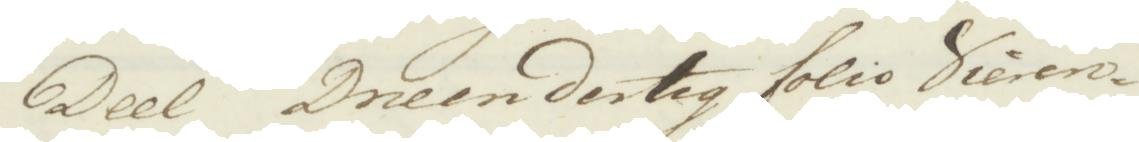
Deel Drie en dertig folio Vieren=
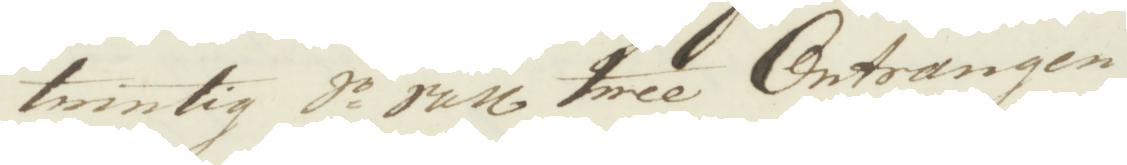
twintig d=o vak twee Ontvangen
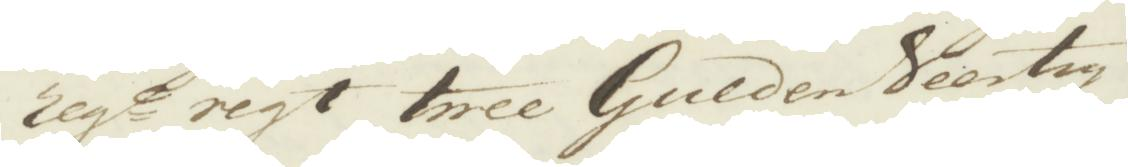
reg=o regt twee Gulden Veertig
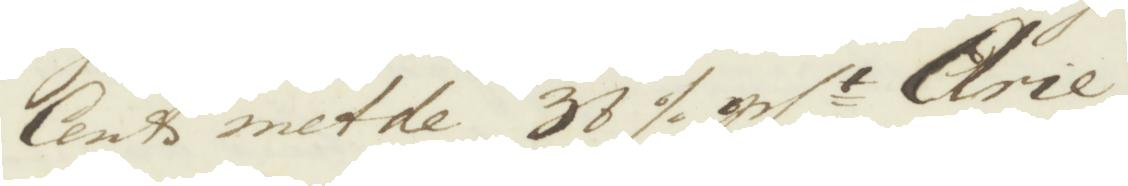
Cent met de 36% opc=t Drie
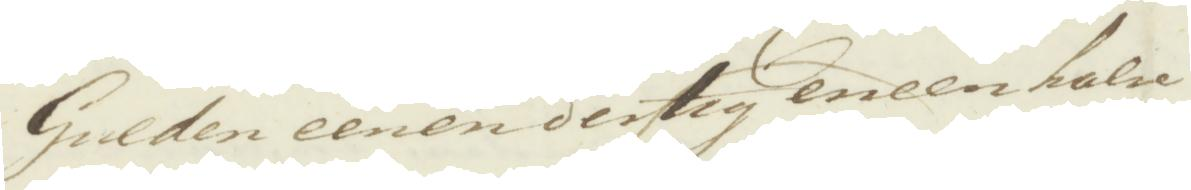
Gulden eenen dertig en een halve
